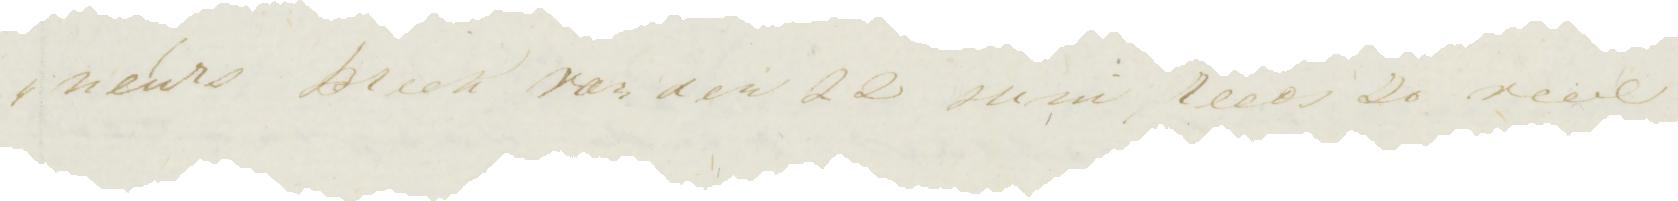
„neurs briev van den 22 juni reeds zo veel
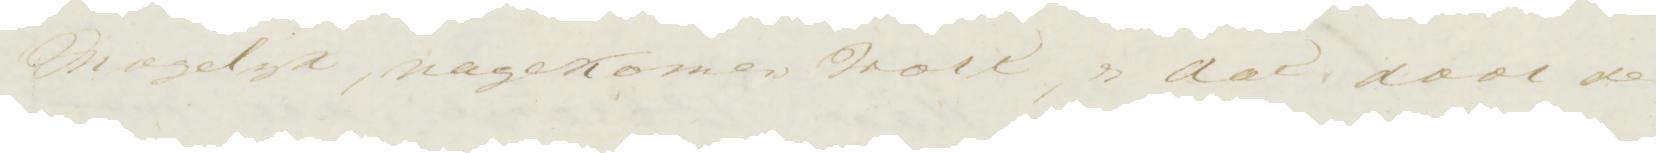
mogelijk, nagekomen wort , en dat door de
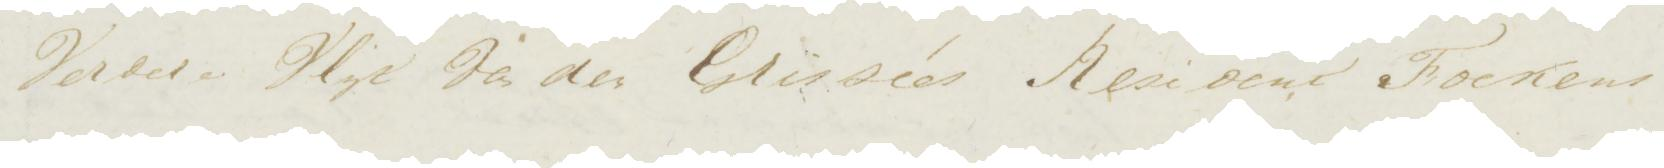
Verdere Vlijt van der Grisseés Resident Fockens
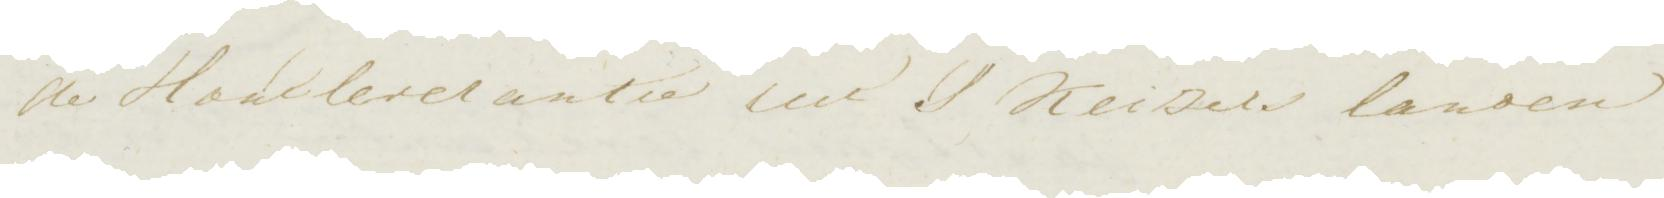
de Houtleverantie ten ’S Keizers landen
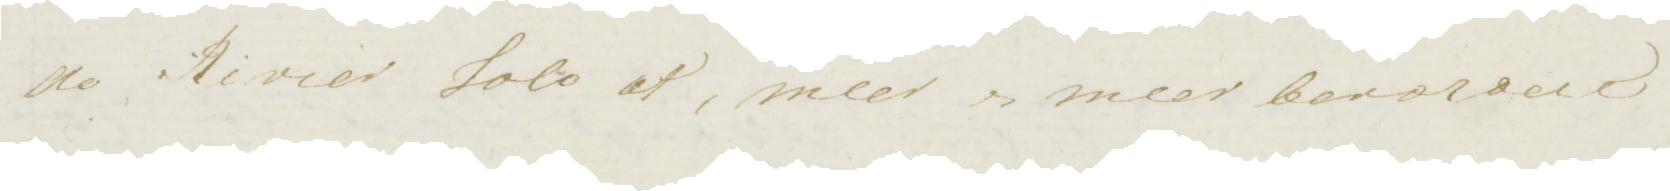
de Rivier Solo af , meer en meer bevordert
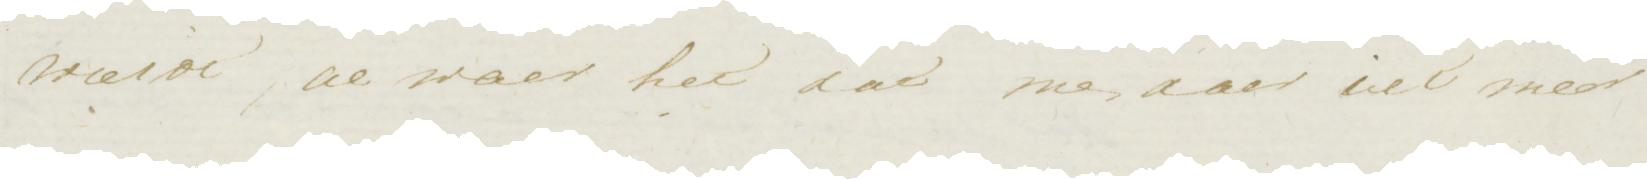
worde , al waer het dat men daar iet meer
